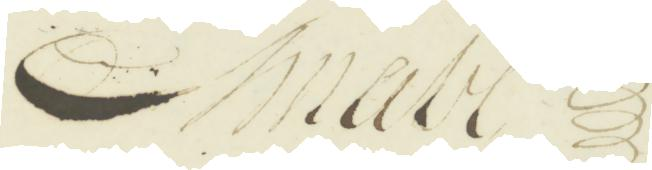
mabé.
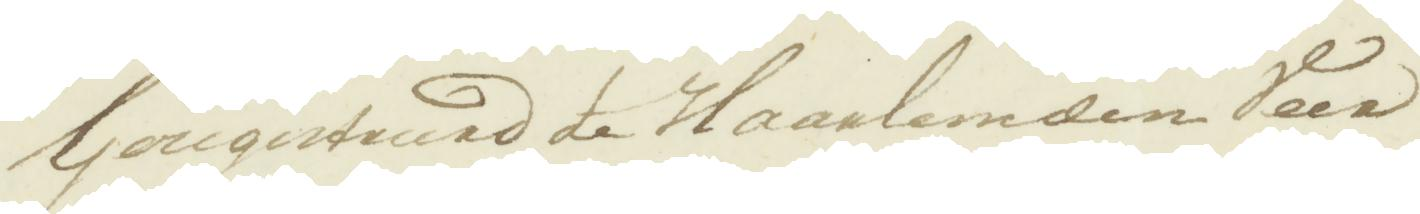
Geregistreerd te Haarlem den Veer
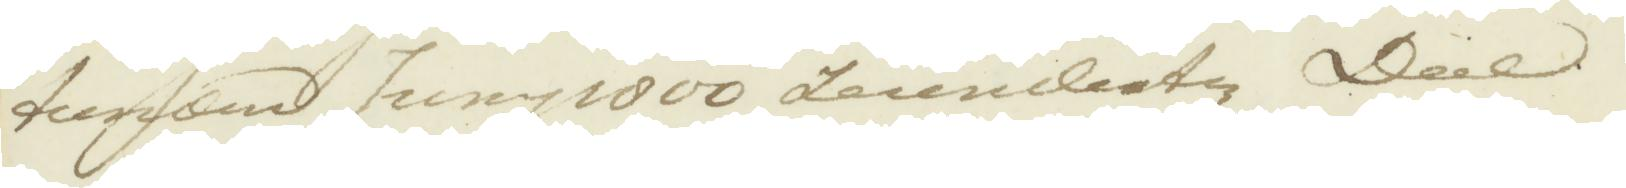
tienden Junij 1800 Zevendertig Deel
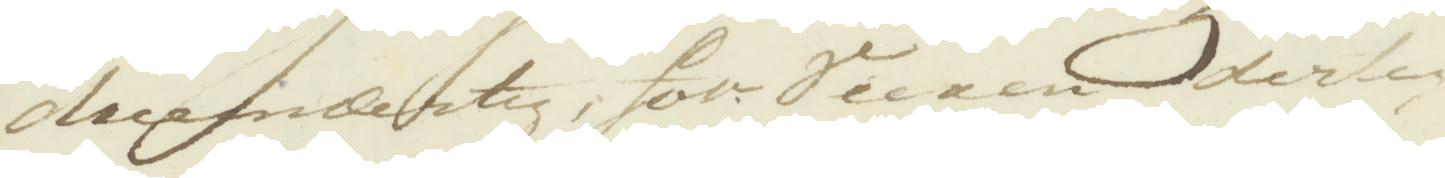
drieendertig, fol. Vier en dertig
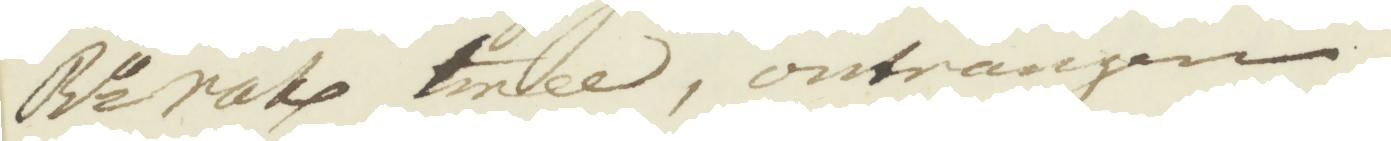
R=o vak twee, ontvangen
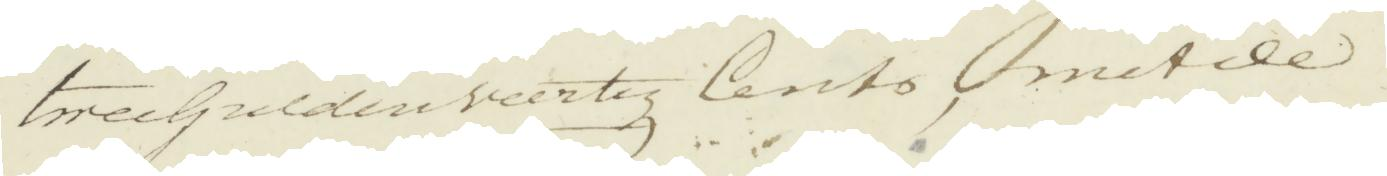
twee Gulden veertig Cents, met de
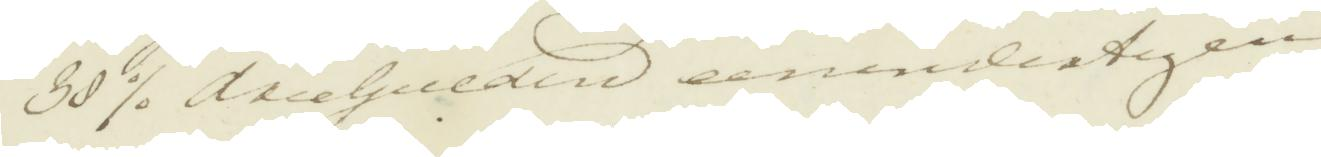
38% drie Gulden eenendertig en
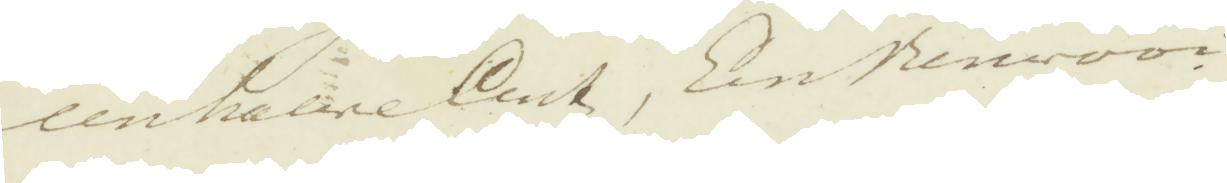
een halve Cent, Een renvooi
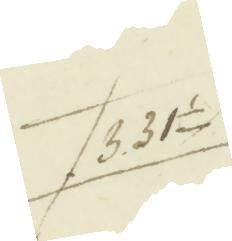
f 3.311/-
